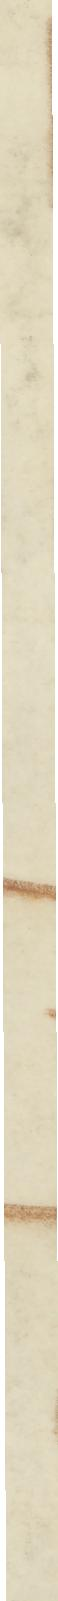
M 446
